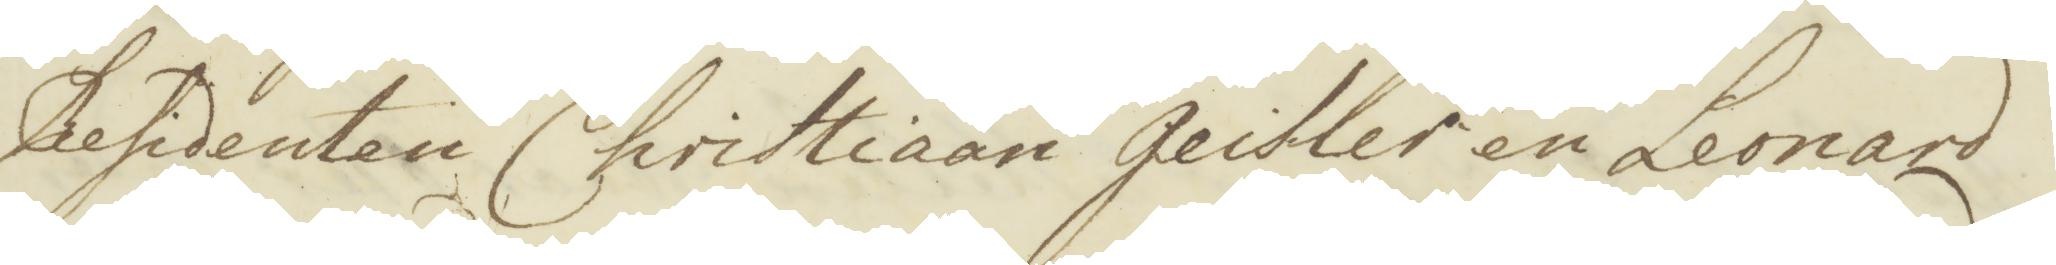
Residenten Christiaan Geisler en Leonard
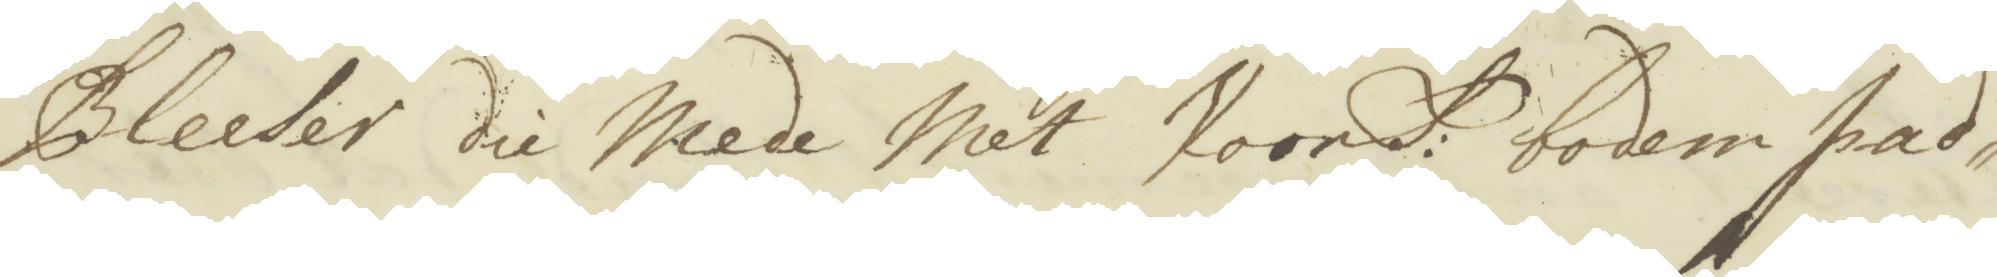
Bleeser die mede met voors: bodem pad„
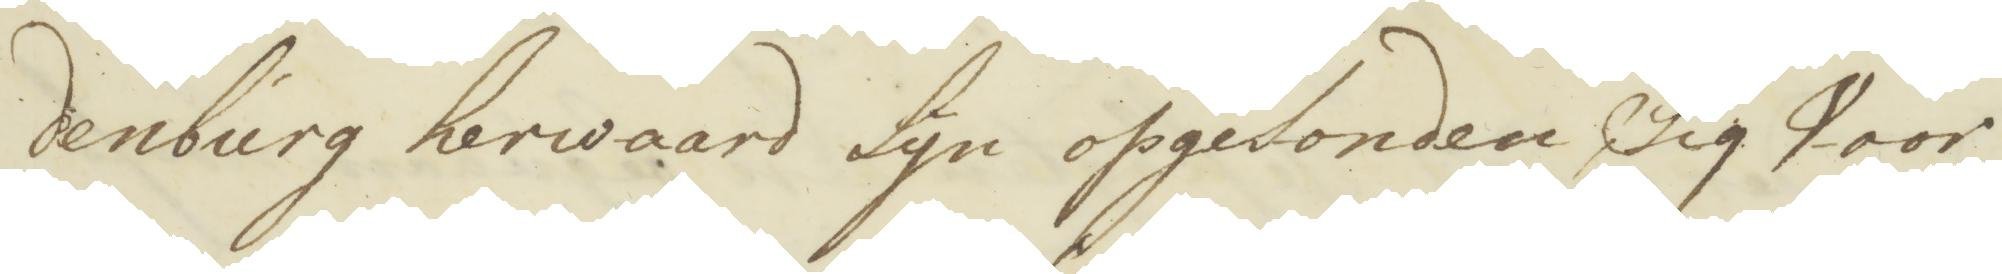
denburg herwaard sijn opgesonden sig voor
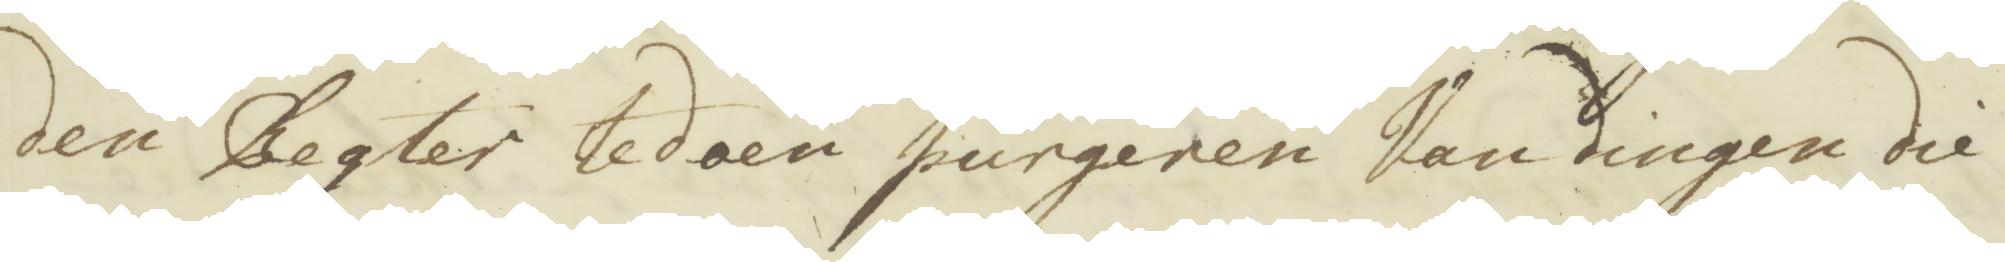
den Regter te doen purgeren Van dingen die
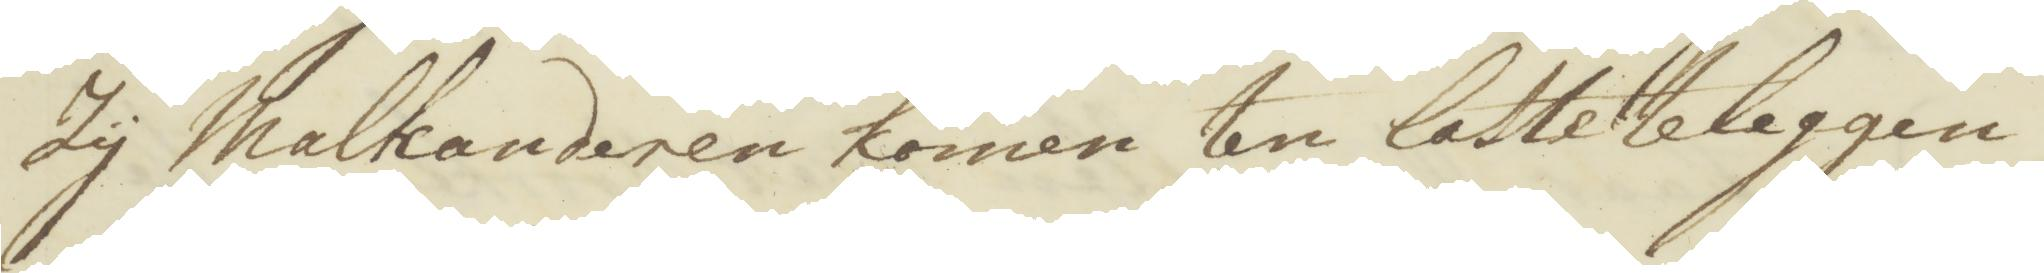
zij malkanderen komen ten laste te leggen
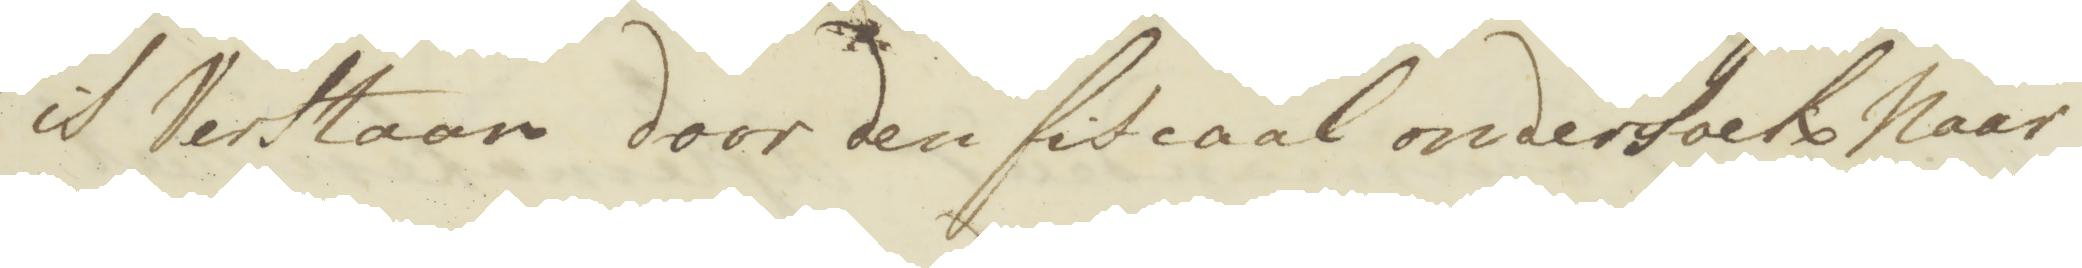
is verstaan door den fiscaal ondersoek naar
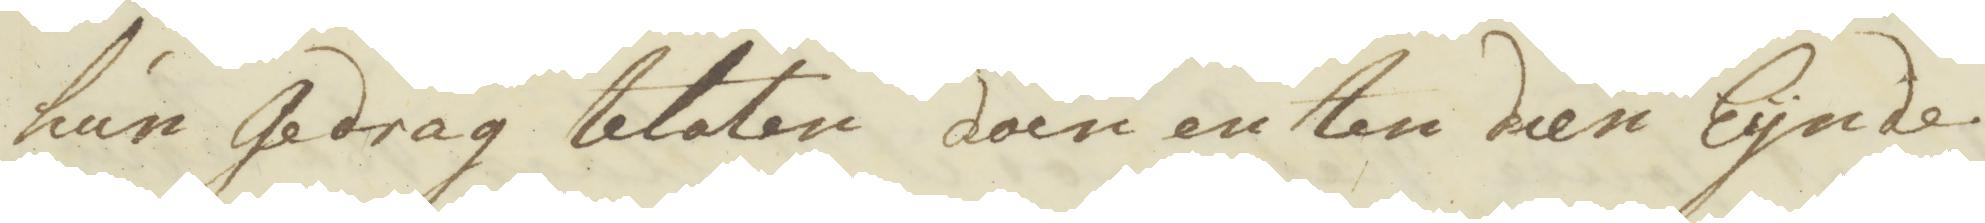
hun gedrag te laten doen en ten dien Eijnde
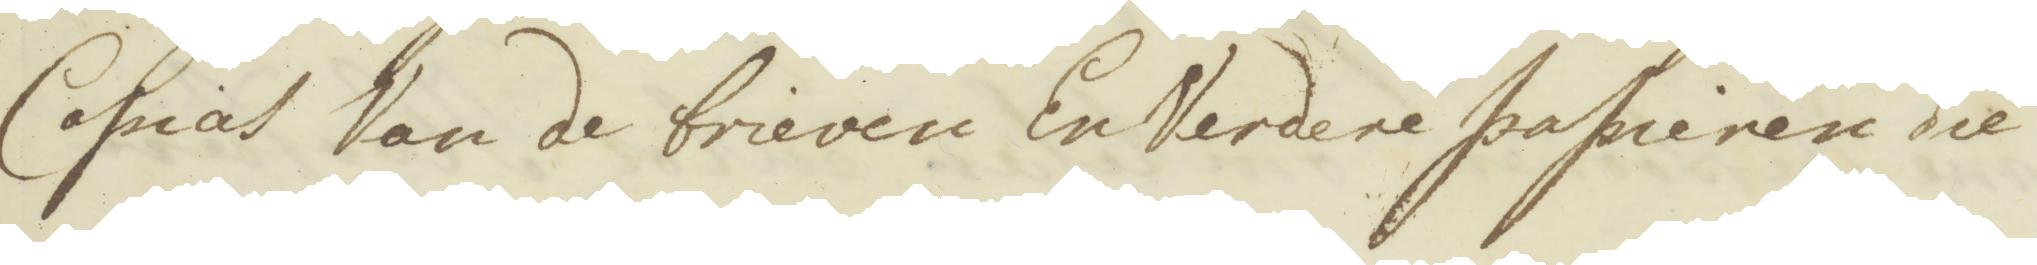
Copias van de brieven En verdere papieren die
